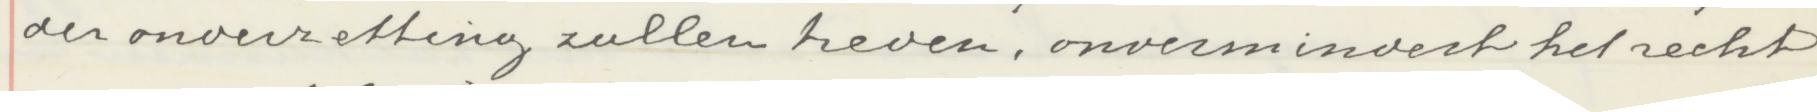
der onderzetting zullen treden, onvermindert het recht
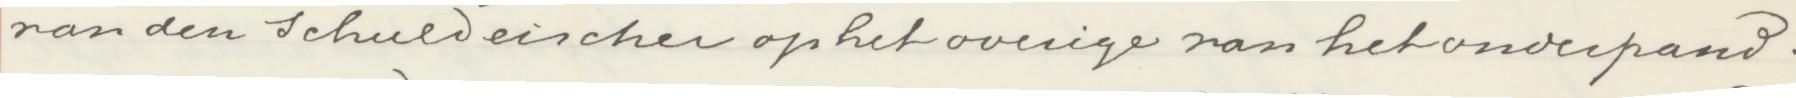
van den schuldeischer op het overige van het onderpand.
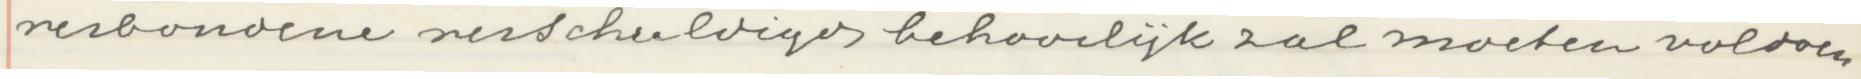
verbondene verschuldige behoorlijk zal moeten voldoen
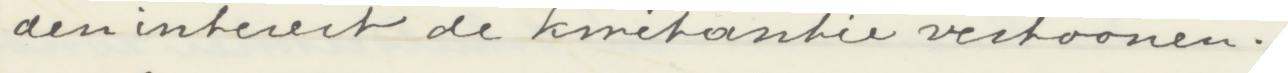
den interest de kwitantie vertoonen.
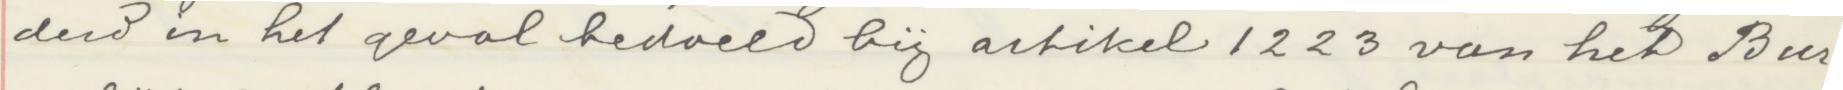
derd in het geval bedoeld bij artikel 1223 van het Bur
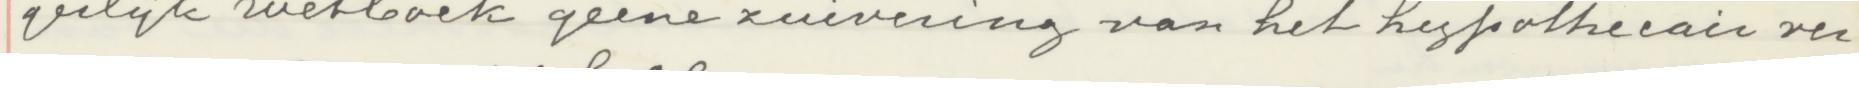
gelijk wetboek geene zuivering van het hypothecair ver
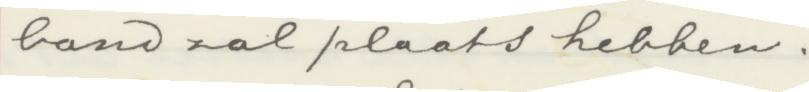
band zal plaats hebben.
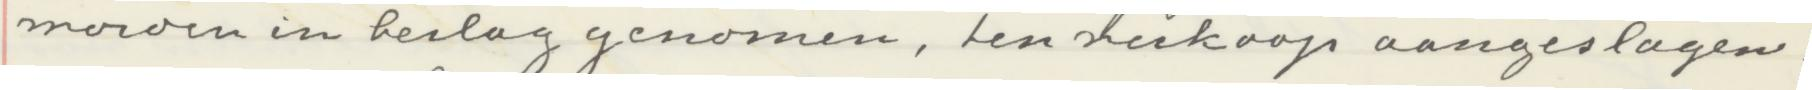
worden in beslag genomen, ten verkoop aangeslagen
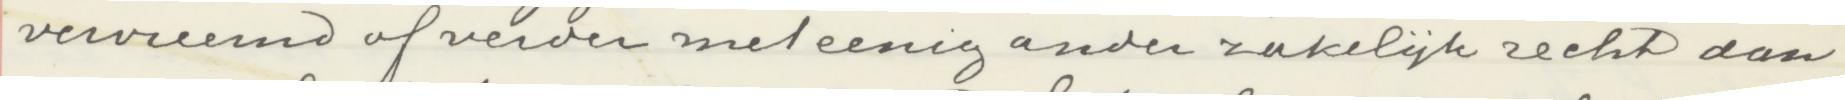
vervreemd of verder met eenig ander zakelijk recht dan
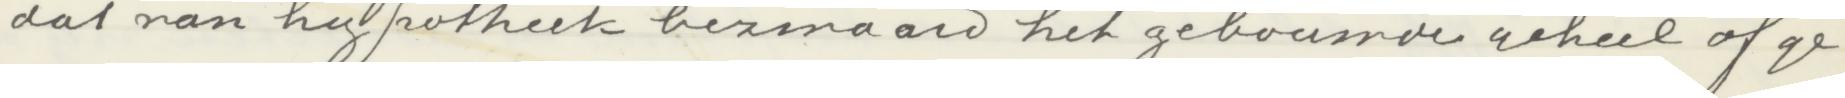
dat van hypotheek bezwaard het gebouwde geheel of ge
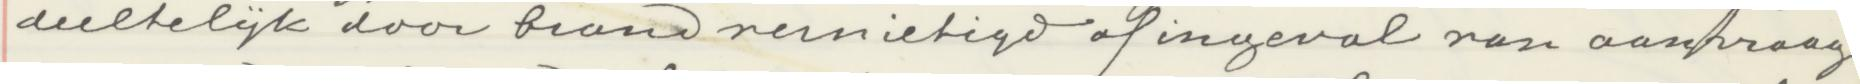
deeltelijk door brand vernietigd of ingeval van aanvraag
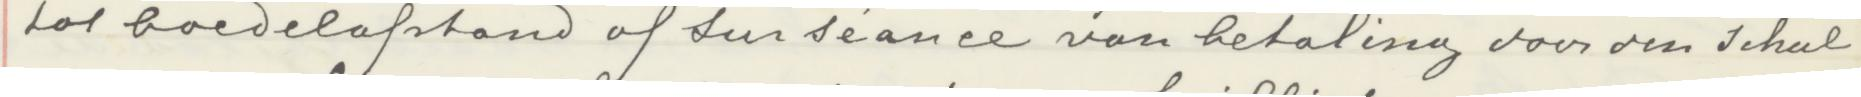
tot boedelafstand of surséance van betaling door den schul
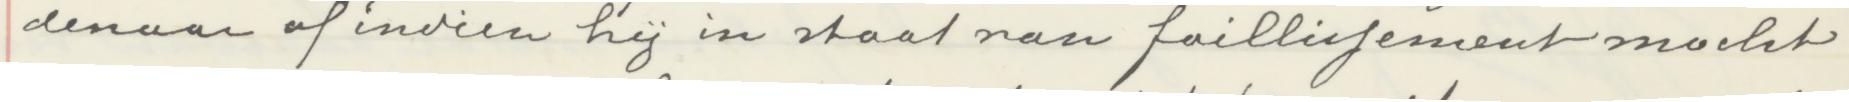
denaar of indien hij in staat van faillissement mocht
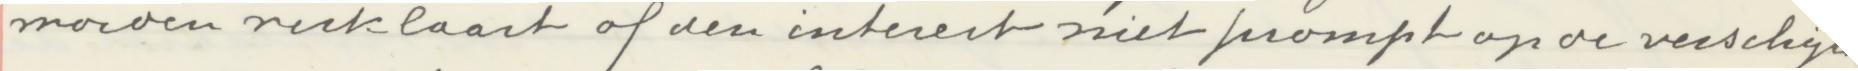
worden verklaart of den interest niet prompt op de verschijn
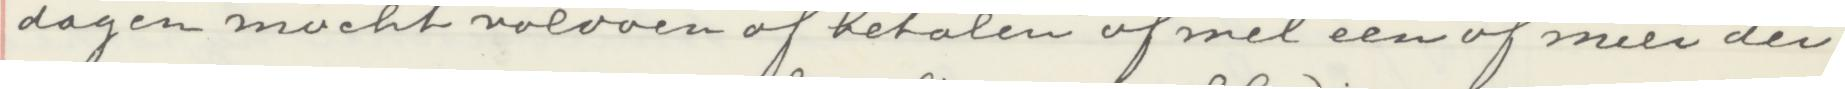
dagen mocht voldoen of betalen of wel een of meer der
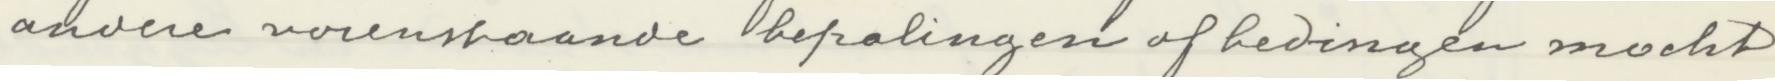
andere vorenstaande bepalingen of bedingen mocht
